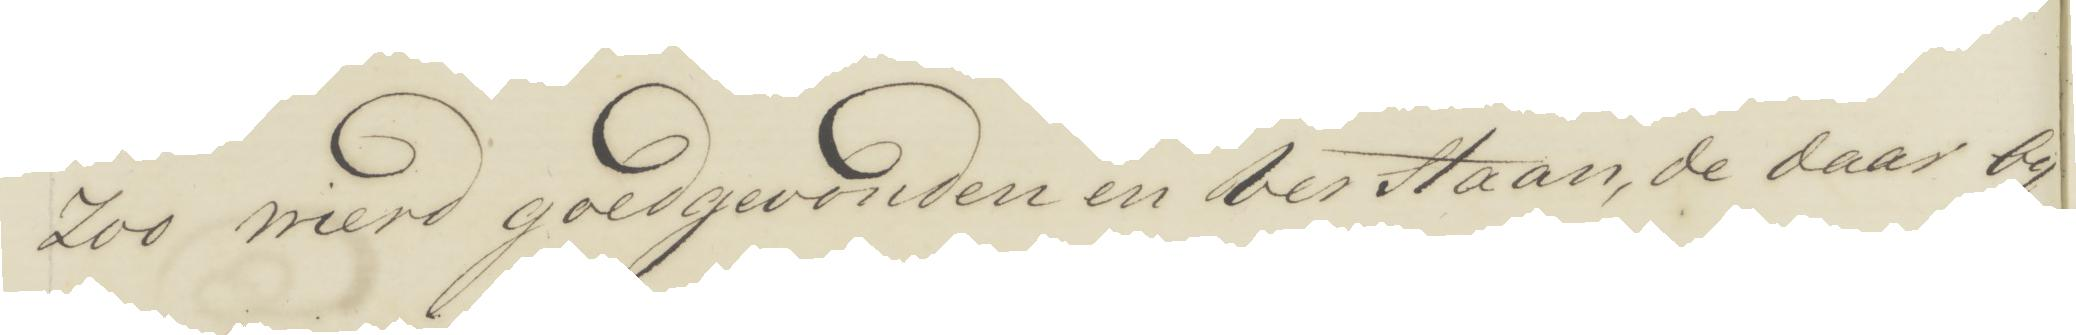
zoo wierd goedgevonden en verstaan, de daar by
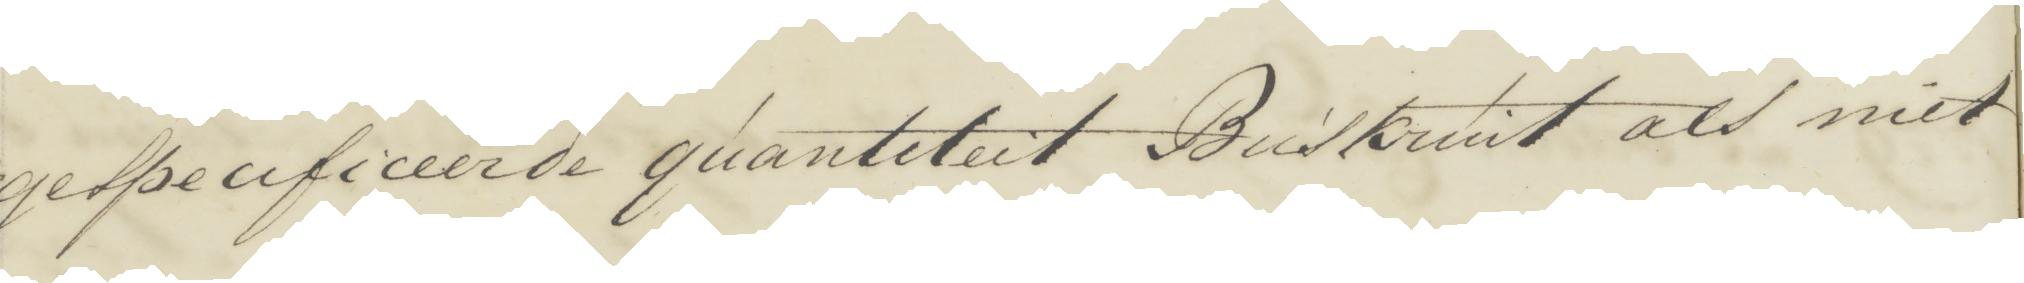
gespecificeerde quantiteit Buskruit als niet
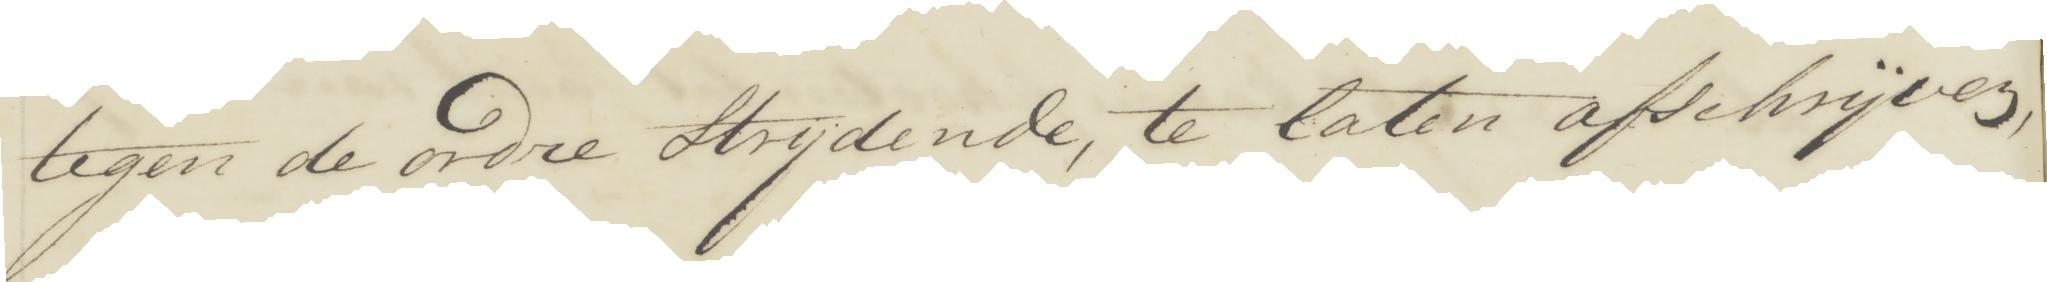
tegen de ordre strijdende, te laten afschrijven
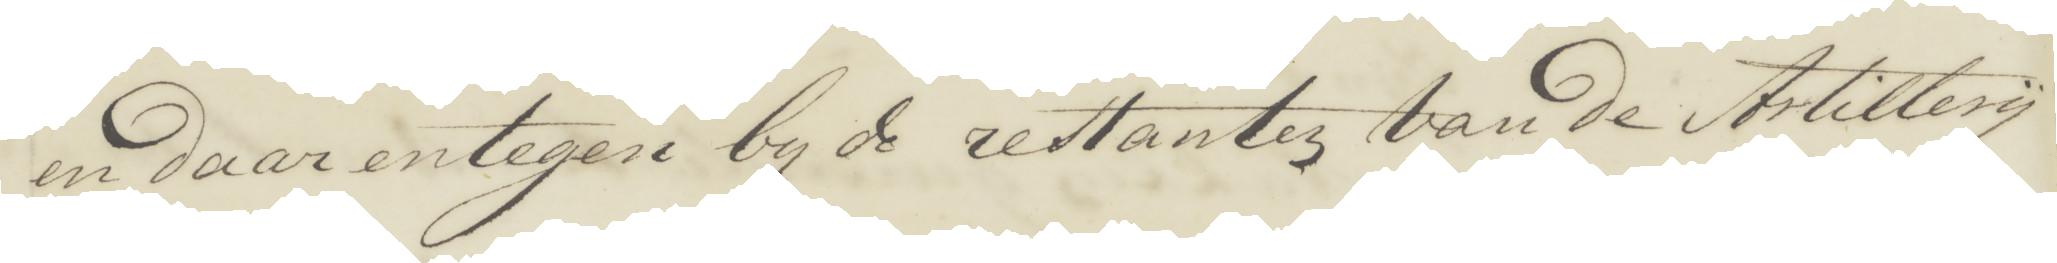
en daar en tegen by de restanten van de Artillerij
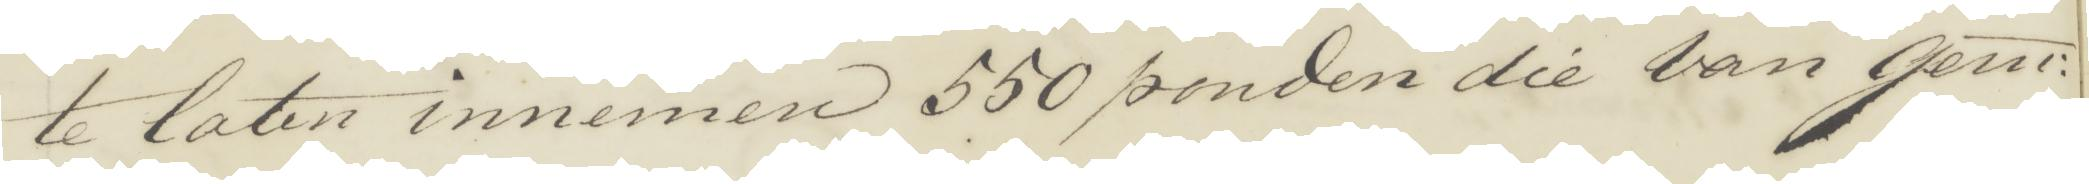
te laten innemen 550 ponden die van gem:
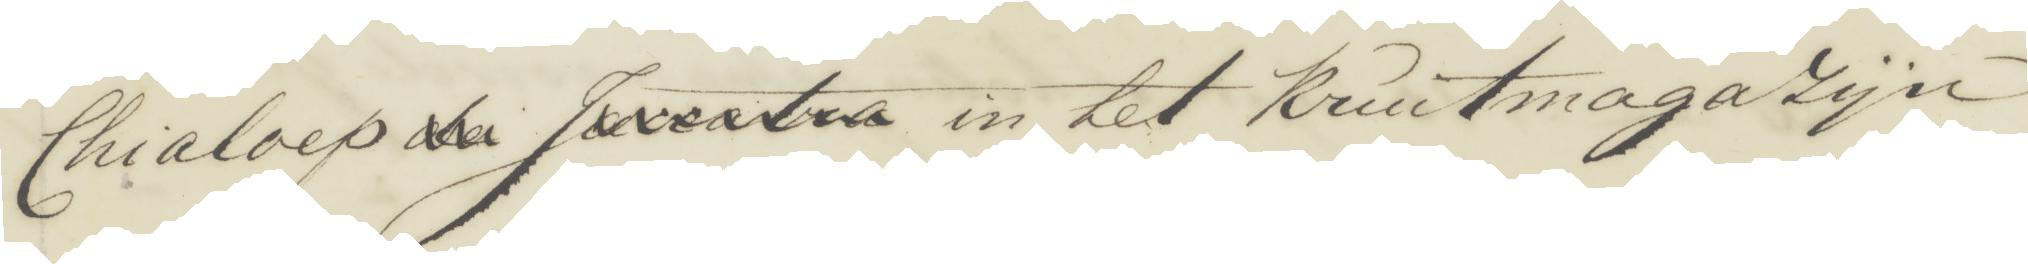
Chialoep de Jaccatra in het kruit magazijn
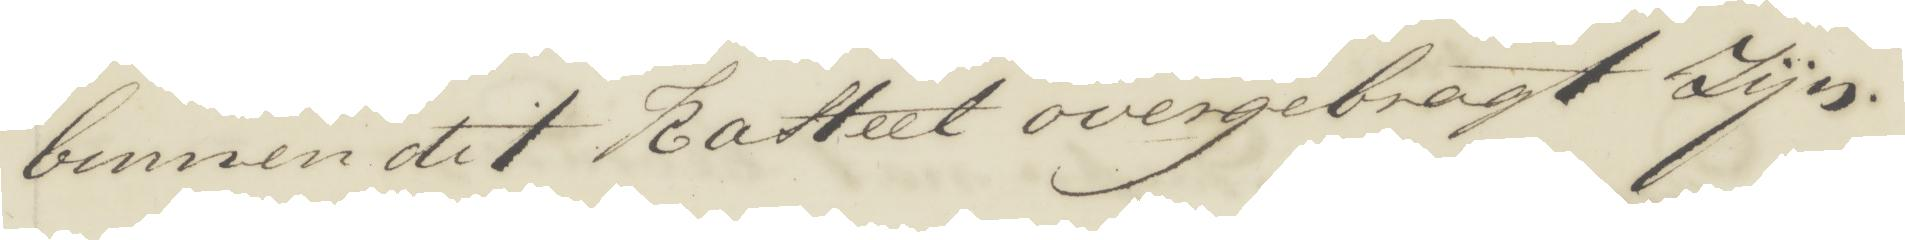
binnen dit Kasteel overgebragt zijn.
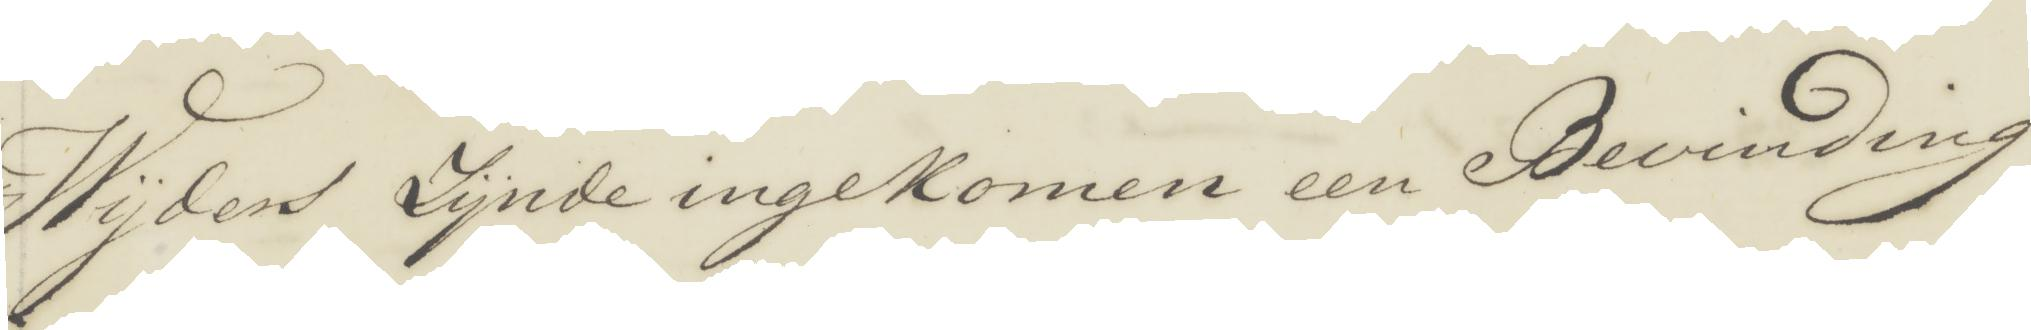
Wijders zijnde ingekomen een Bevinding
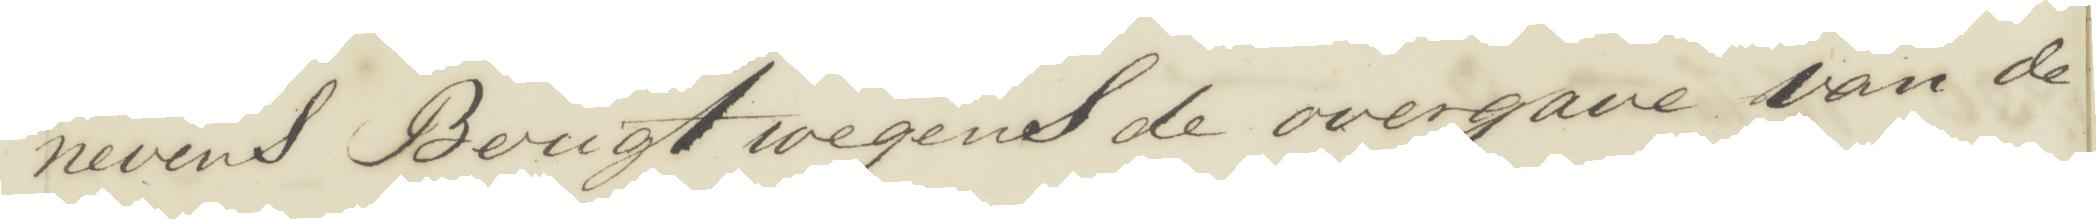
nevens Berigt wegens de overgave van de
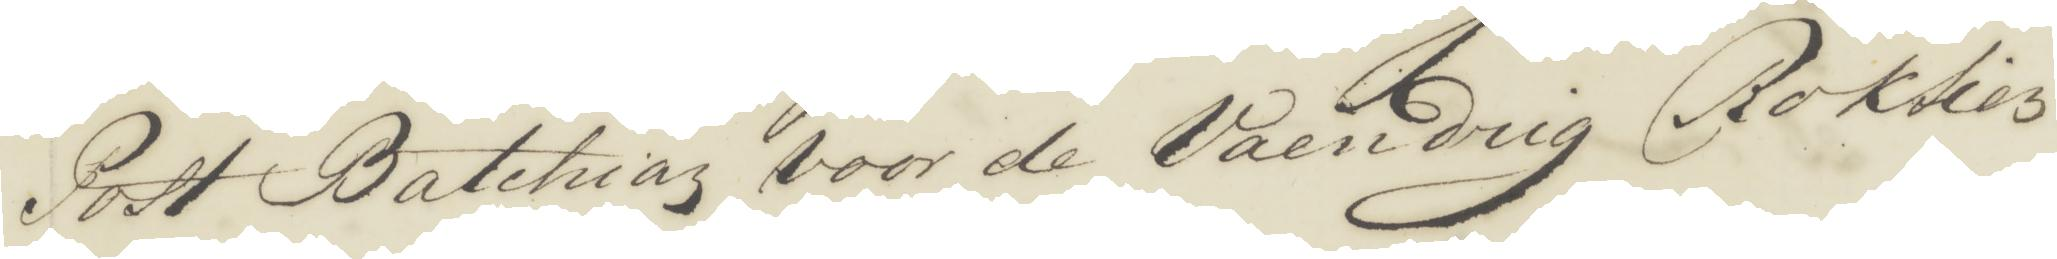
Post Batchian voor de Vaendrig Roksien
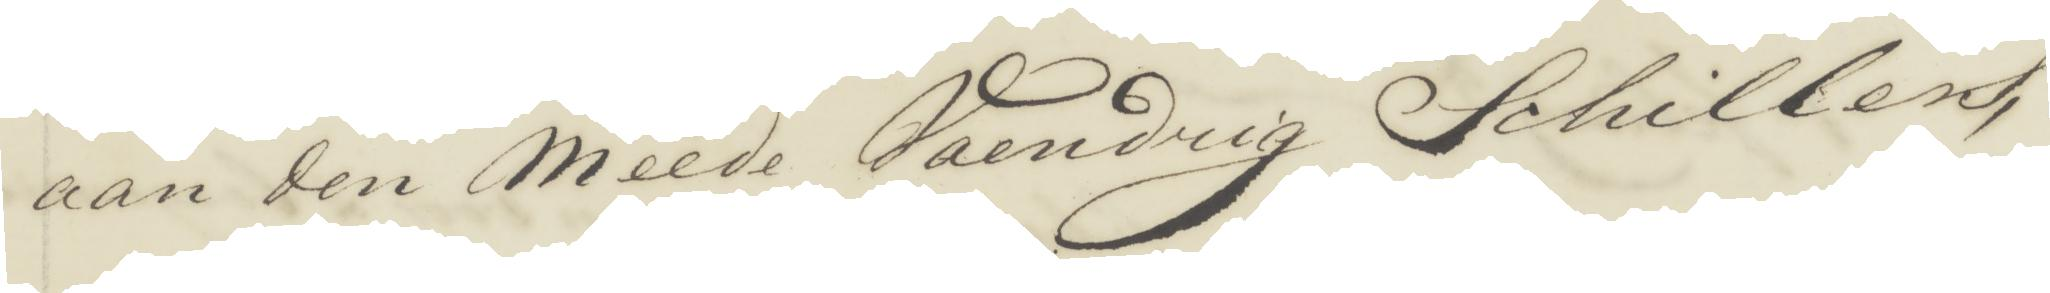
aan den meede Vaendrig Schillens,
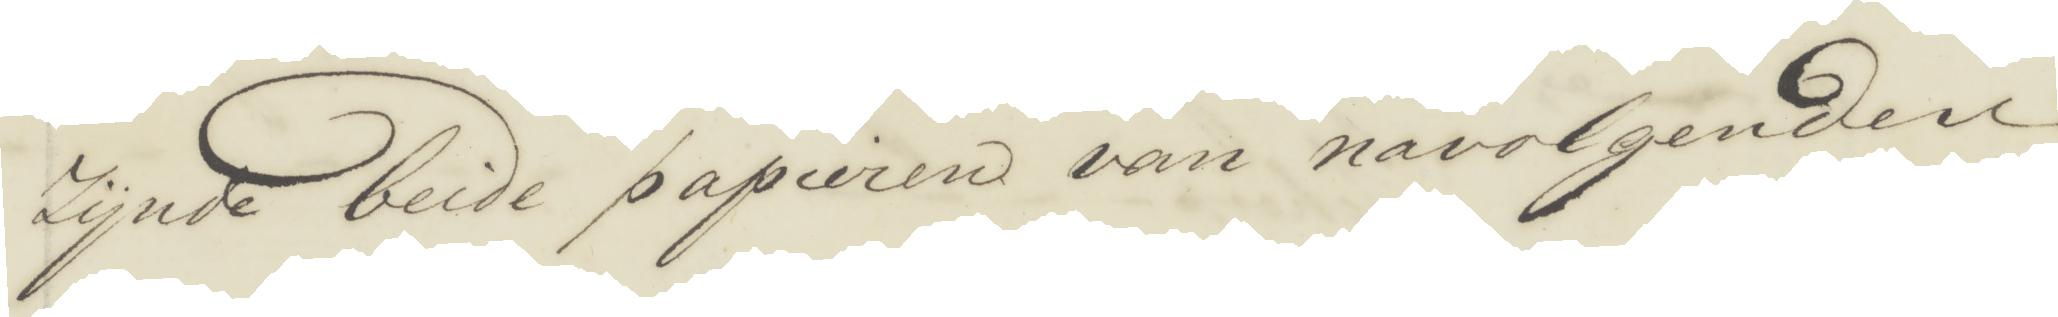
zijnde beide papieren van navolgenden
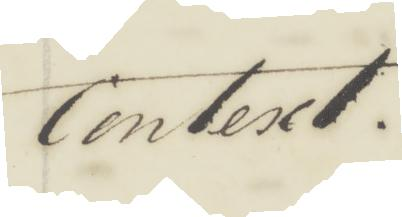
context.
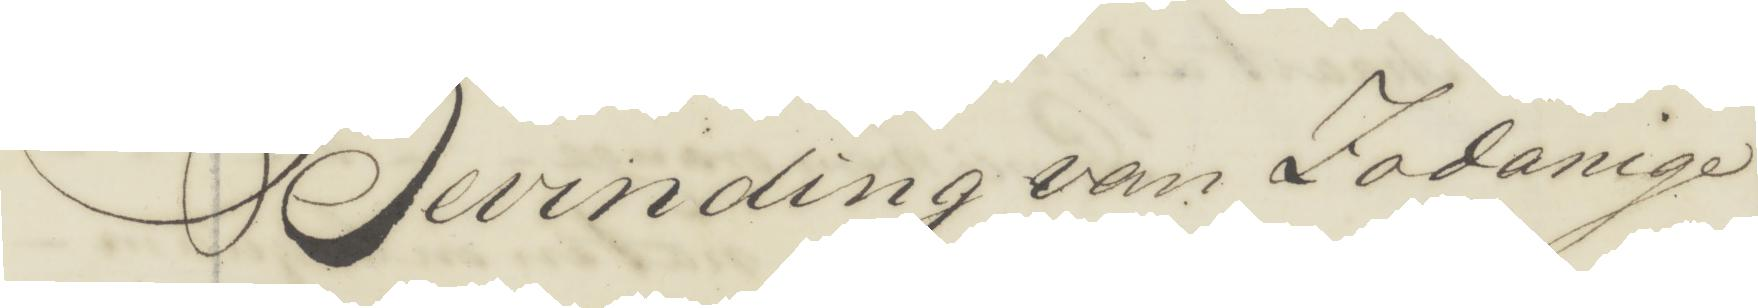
Bevinding van zodanige
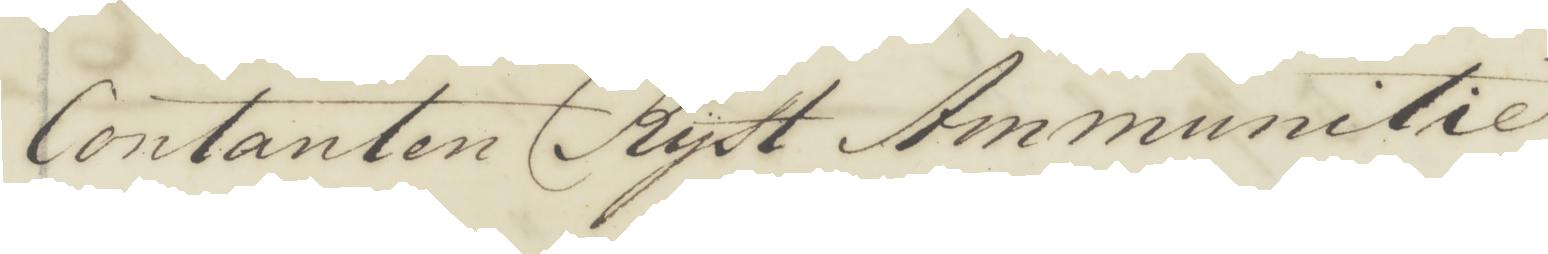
contanten Rijst Ammunitie
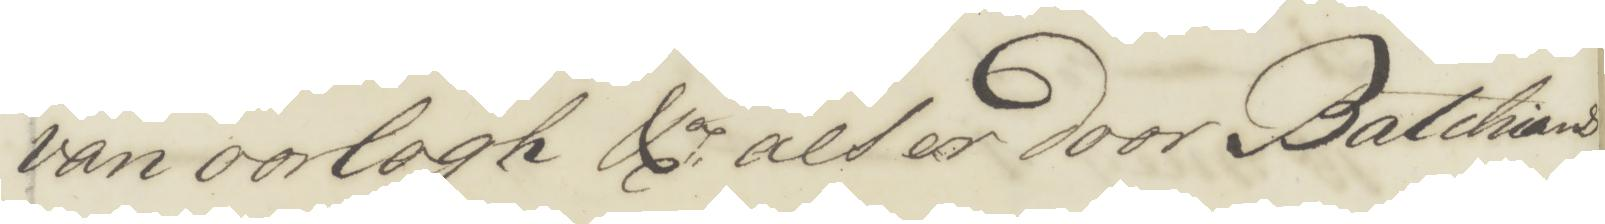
van oorlogh &„a als er door Batchian
